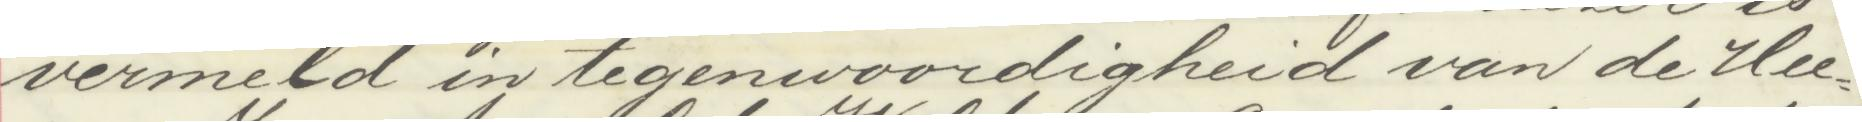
vermeld in tegenwoordigheid van de Hee=
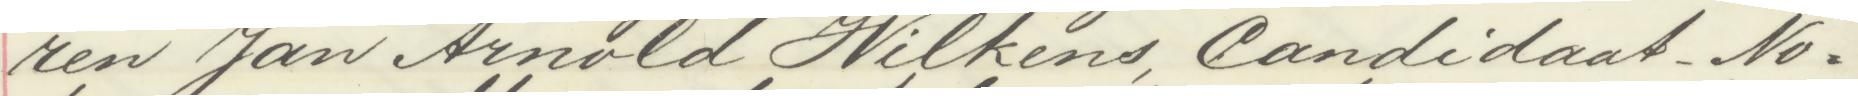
ren Jan Arnold Wilkens, Candidaat - No=
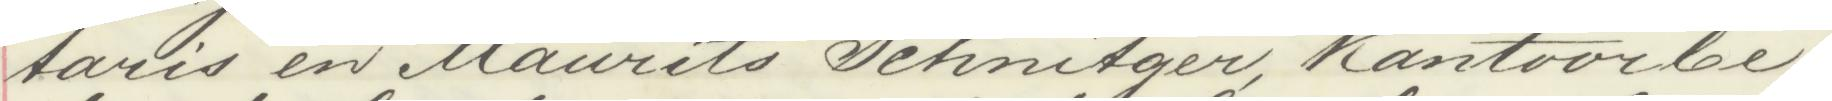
taris en Maurits Schnitger, Kantoor be-
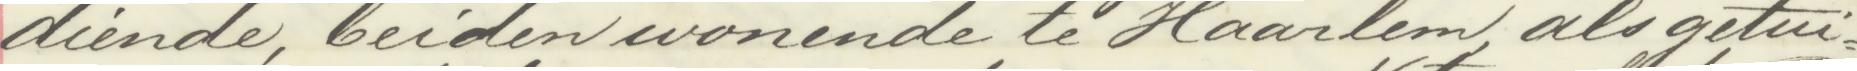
diende, beiden wonende te Haarlem als getui
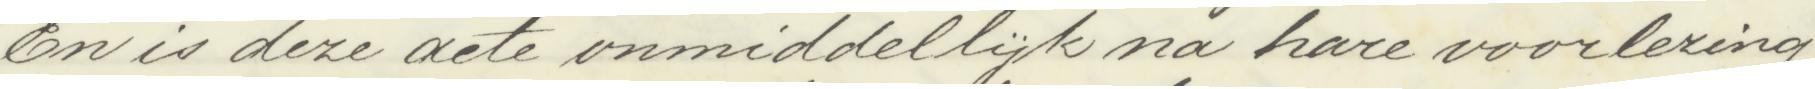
Een is deze acte onmiddellijk na hare voorlezing
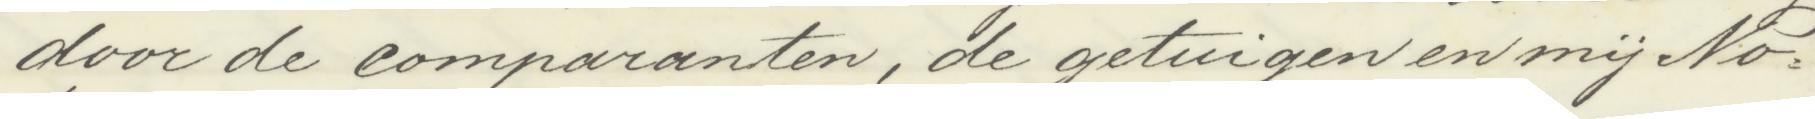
door de comparanten, de getuigen en mij No=
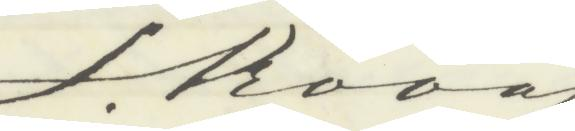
S. Boog
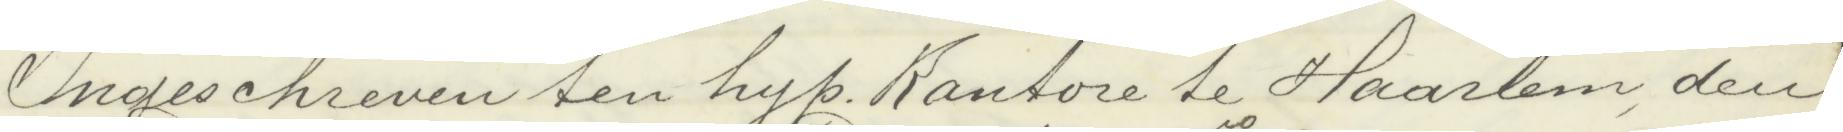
Ingeschreven ten hyp. Kantore te Haarlem, den
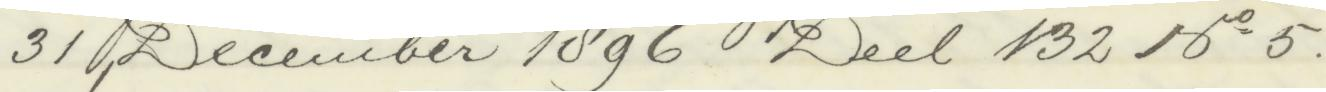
31 December 1896 Deel 132 N=o 5
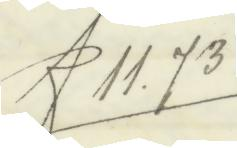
ƒ 11.73
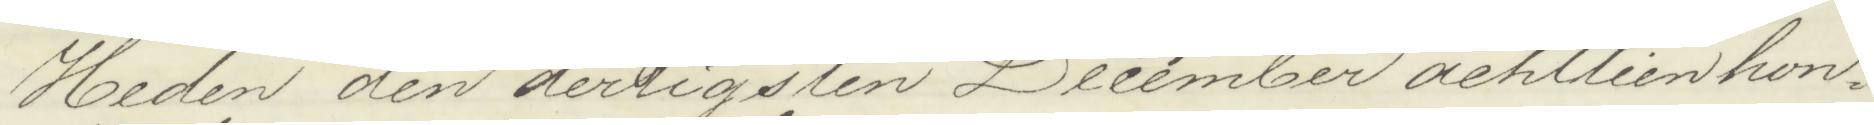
Heden den dertigsten December achttien hon=
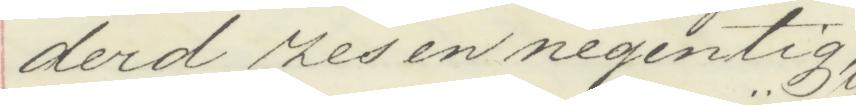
derd zes en negentig
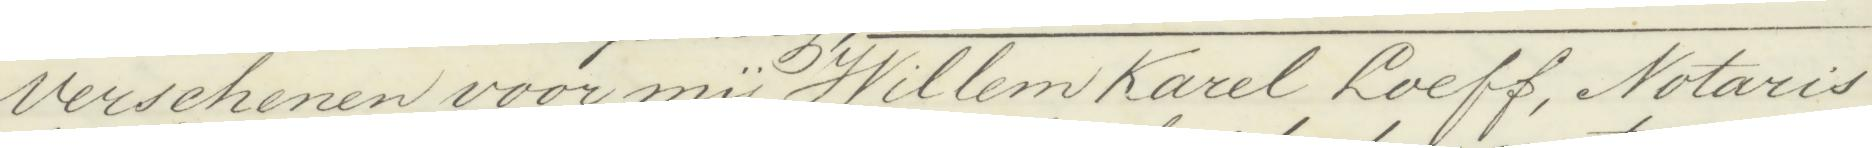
verschenen voor mij Willem Karel Loeff, Notaris
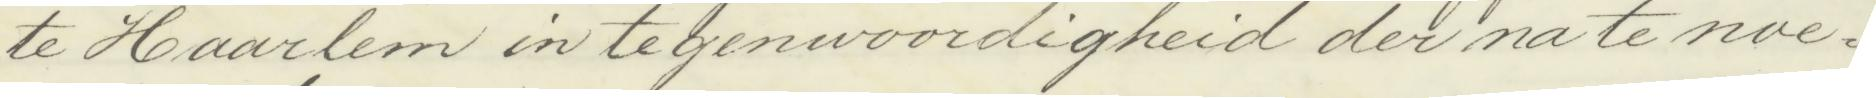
te Haarlem in tegenwoordigheid der na te noe=
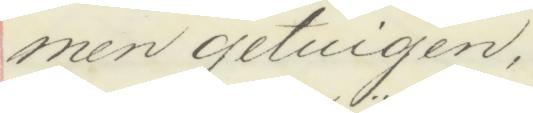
men getuigen,
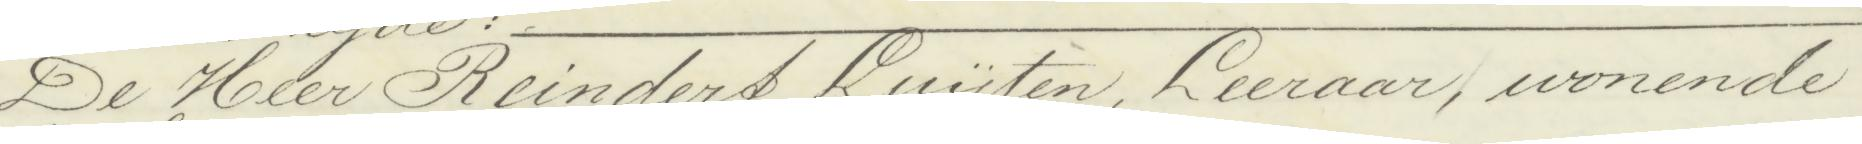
De Heer Reindert Luijten, Leeraar, wonende
